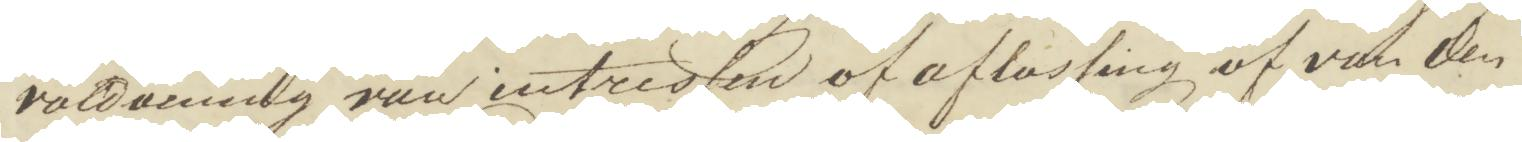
voldoening van intressen of aflossing of van den
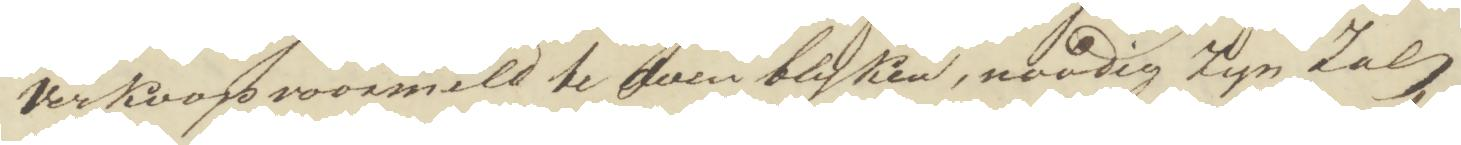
verkoop voormeld te doen blyken, noodig zyn zal
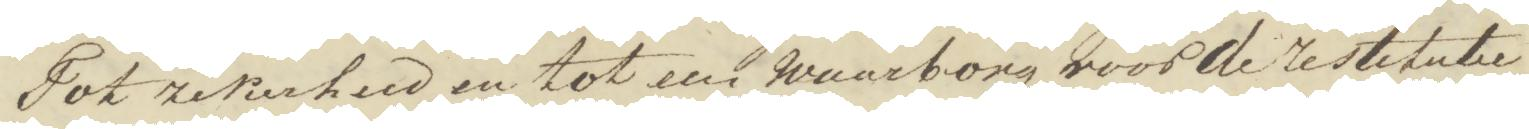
Tot zekerheid en tot een waarborg voor de restitutie
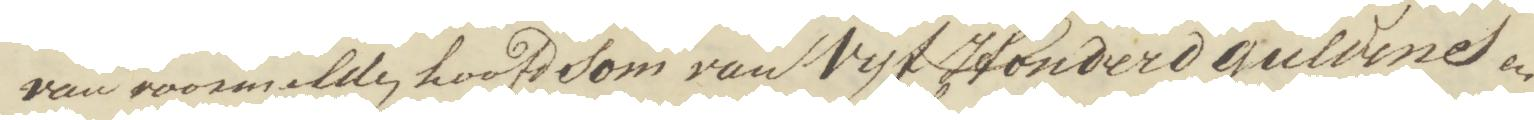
van voormelden hoofdsom van Vyf Honderd guldens en
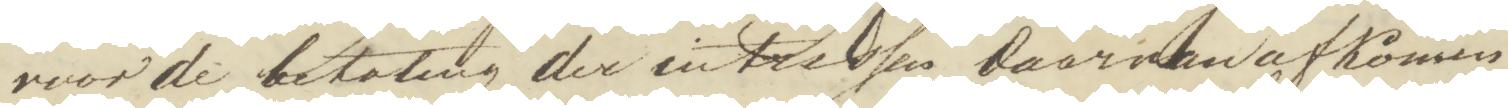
voor de betaling der intressen daarvan afkomen
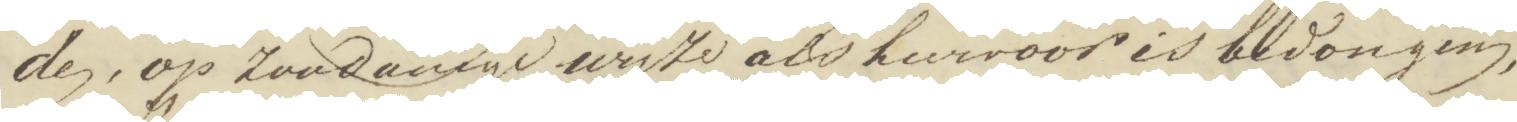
den, op zoodanige wijze als hiervoor is bedongen,
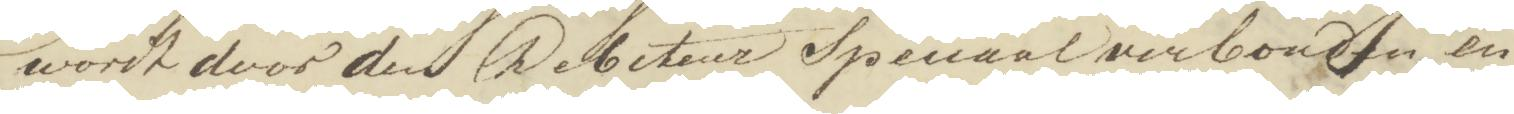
wordt door den Debiteur speciaal verbonden en
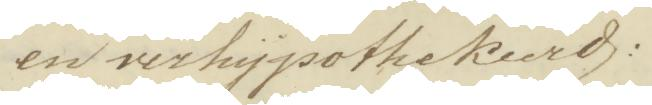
en verhijpothekeerd:
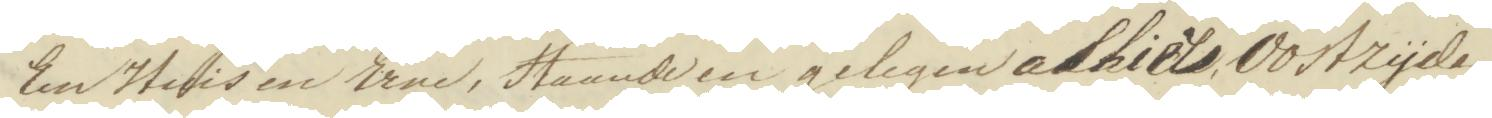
Een Huis en Erve, staande en gelegen alhier, Oostzijden
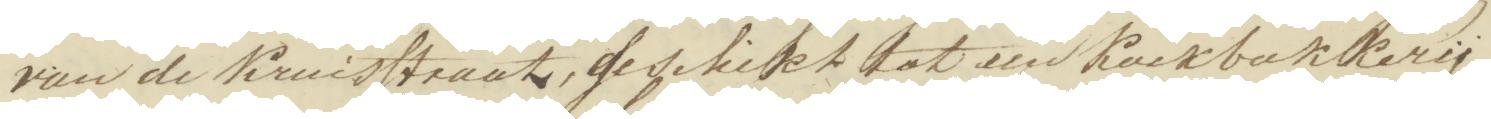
van de Kruisstraat, geschiet tot een Koekbakkerij
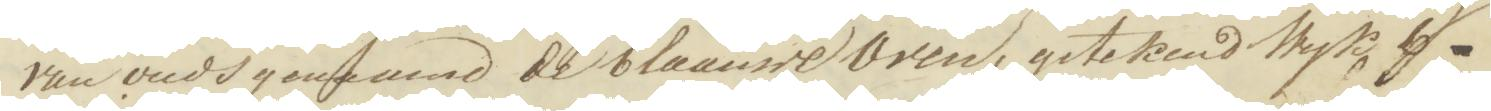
van ouds genaamd de blaauwe Oven, getekend Wyk 6 —
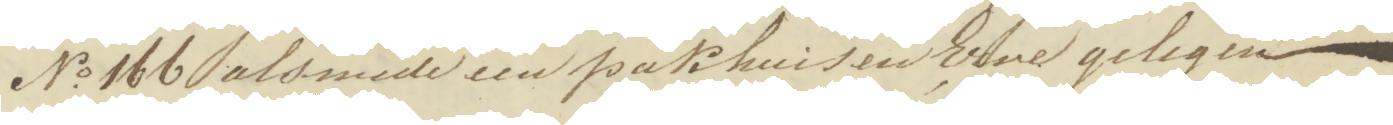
N=o 166 alsmede een pakhuis en Erve gelegen —
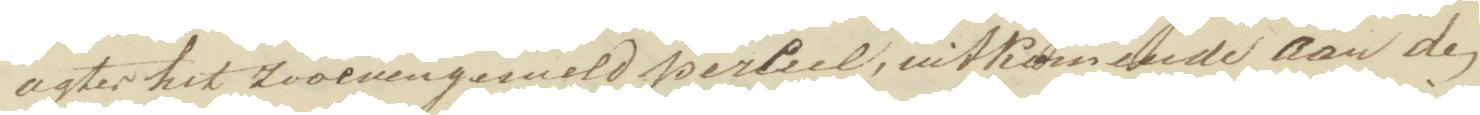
agter het zooeven gemeld perceel, uitkomende aan den
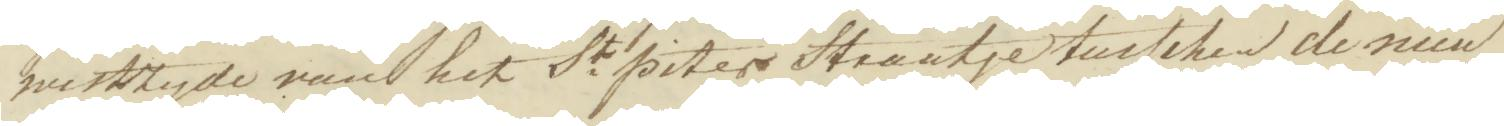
westzyde van het s„t Piter straatje tuschen de nieu
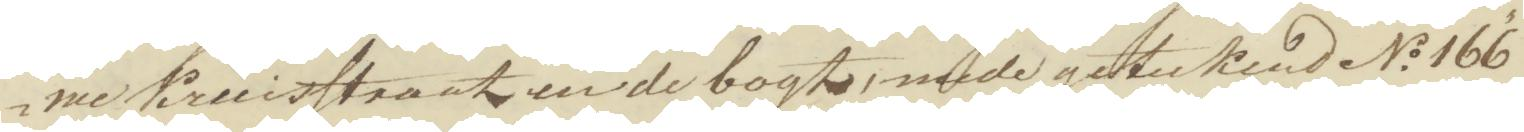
„we Kruisstraat en de bogt, mede geteekend N.o 166
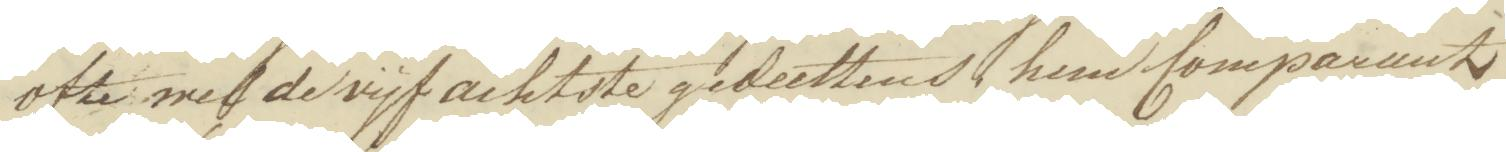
ofte wel de vijf achtste gedeeltens hem Comparant
